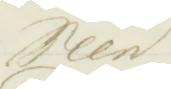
Veen
